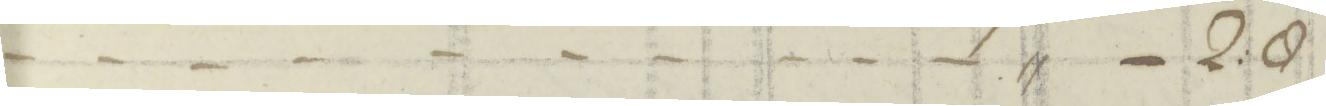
– – – – – – – – – – „ – 2:8
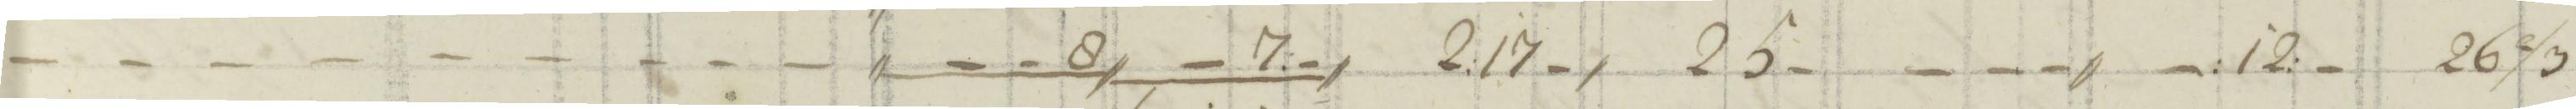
– – – – – – – – – „ – – 8„ – 7:–„ 2:17–„ 25– – – –„ –:12: – 26 2/3
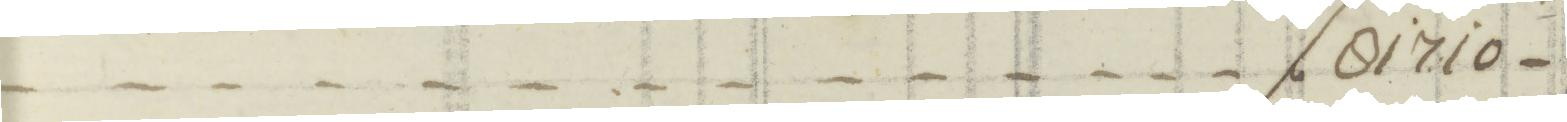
– – – – – – – – – – – – – – ƒ 817:10 –
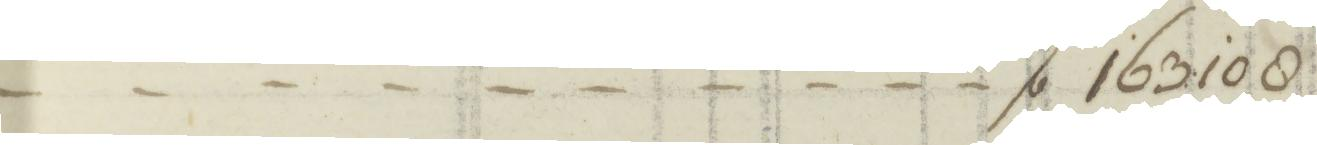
– – – – – – – – – – ƒ 163:10 8
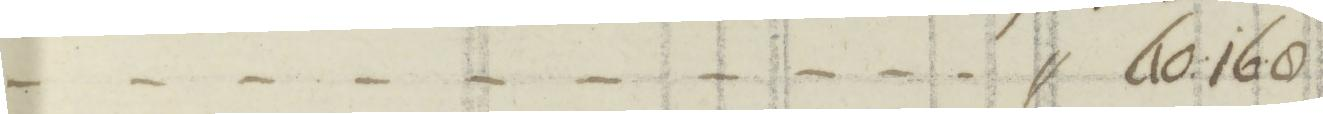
– – – – – – – – – – - „ 40:16:8
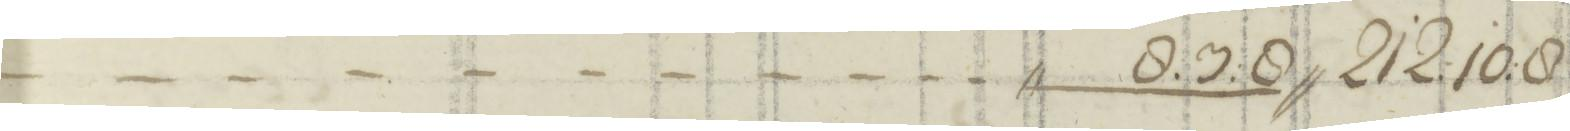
– – – – – – – – – - - „ 8.3:8„ 212.10:8
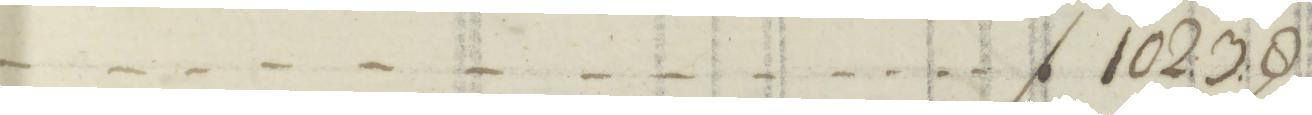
– – – – – – – – – – - - - ƒ 102:3:8
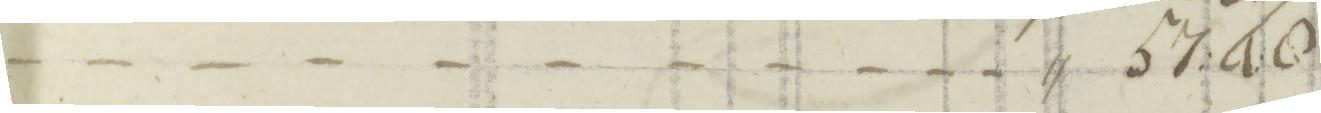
– – – – – – – – – – – „ 57:4:8
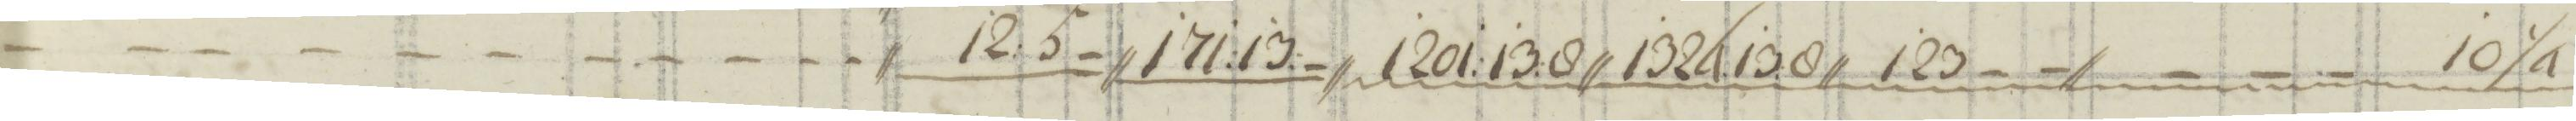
– – – – – – – – – – – „ 12:5 – „ 171:13:– „ 1201:13:8 „ 1324:13:8 „ 123 – – „ – – – 10¼
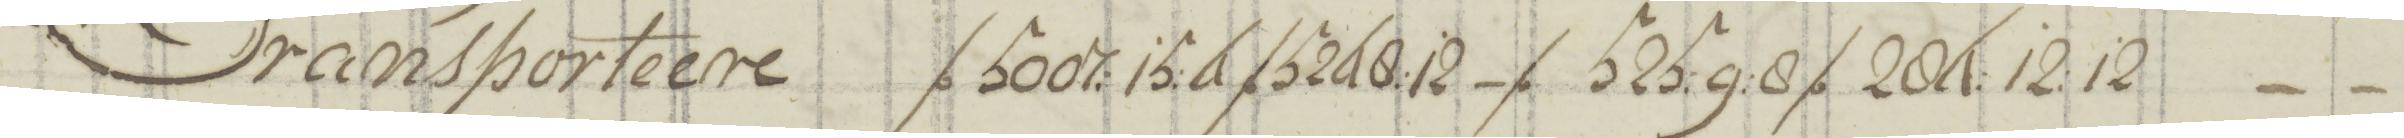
Transporteere ƒ 5007:15:4 ƒ5248:12 ƒ525:9:8 ƒ 284:12:12 – –
